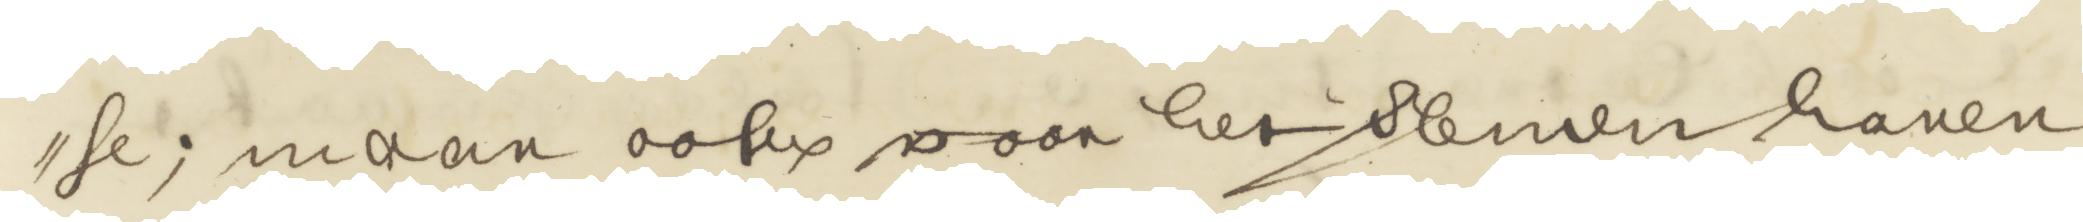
„se; maar ook voor het verlenen haren
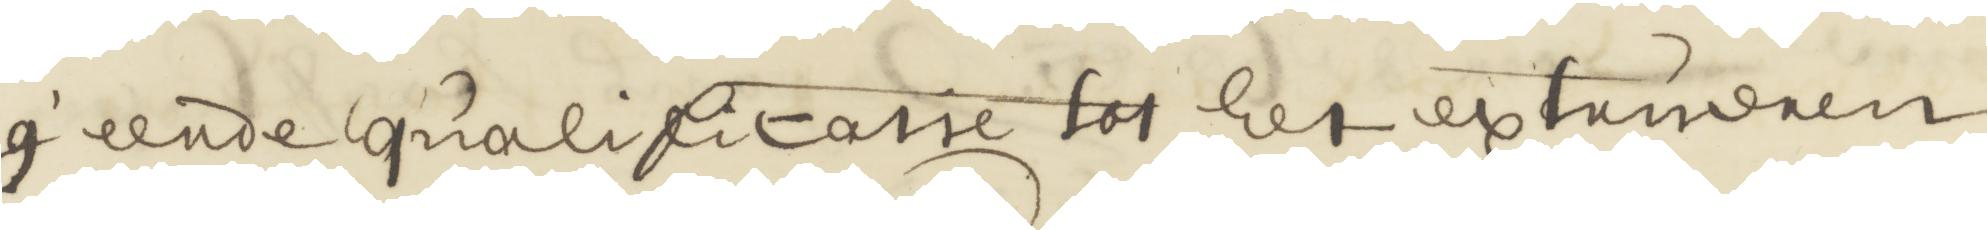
g’eerde qualificatie tot het extrueren
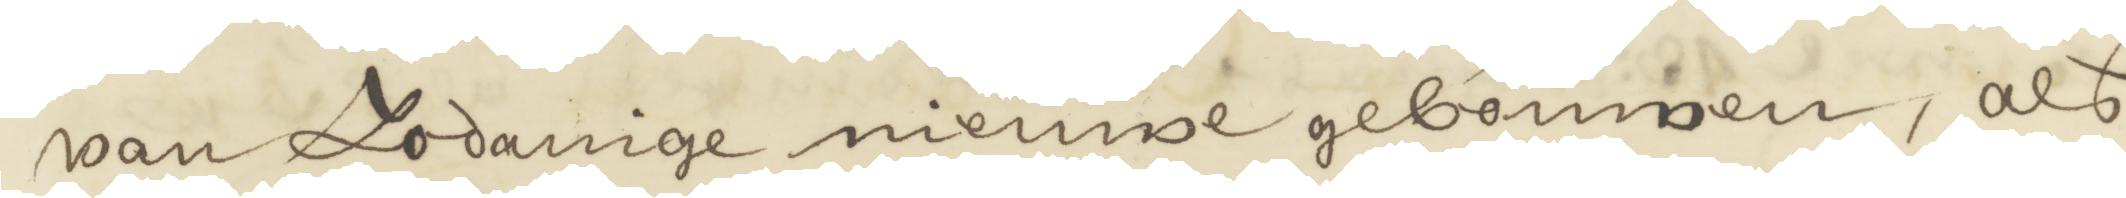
van zodanige nieuwe gebouwen, als
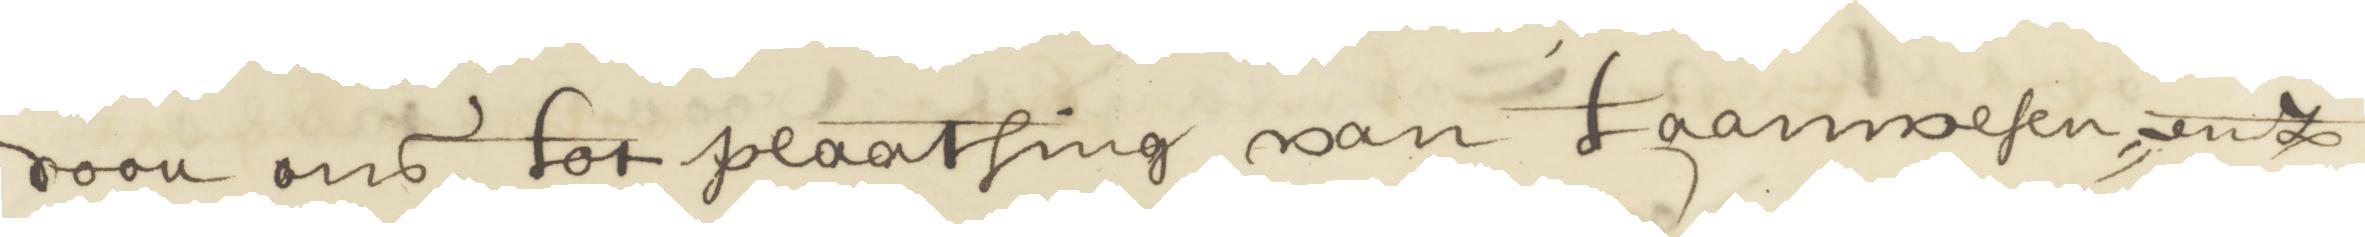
door ons tot plaatsing van 't aanwesen„ enz
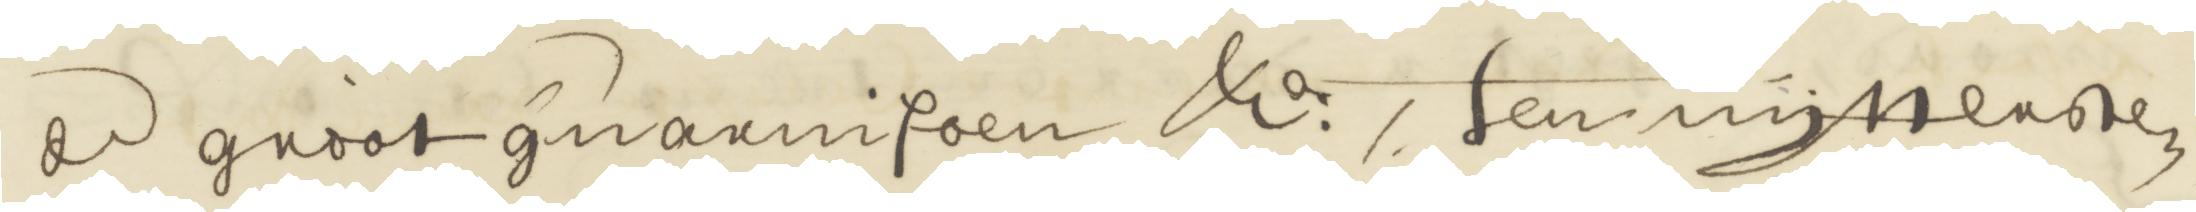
de groot guarnisoen &:a, ten uijttersten
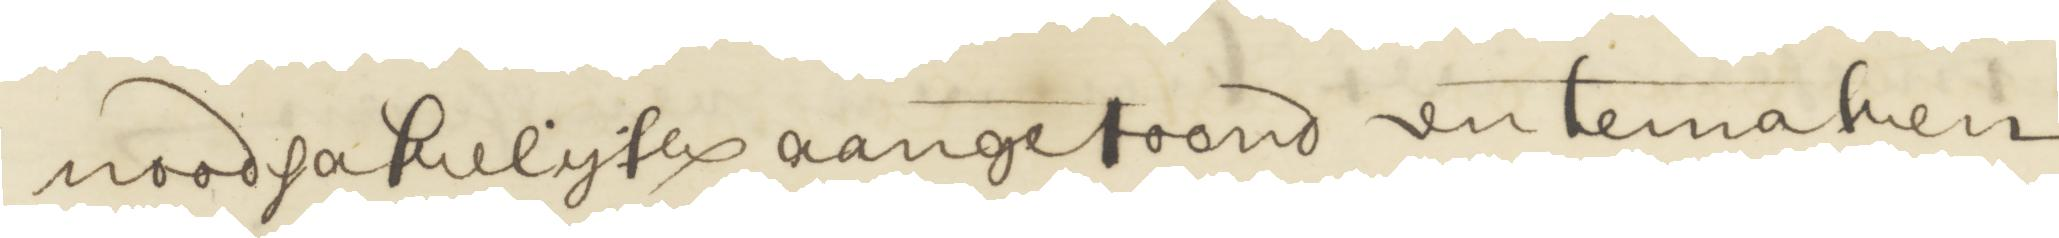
noodsakelijk aangetoond en te maken
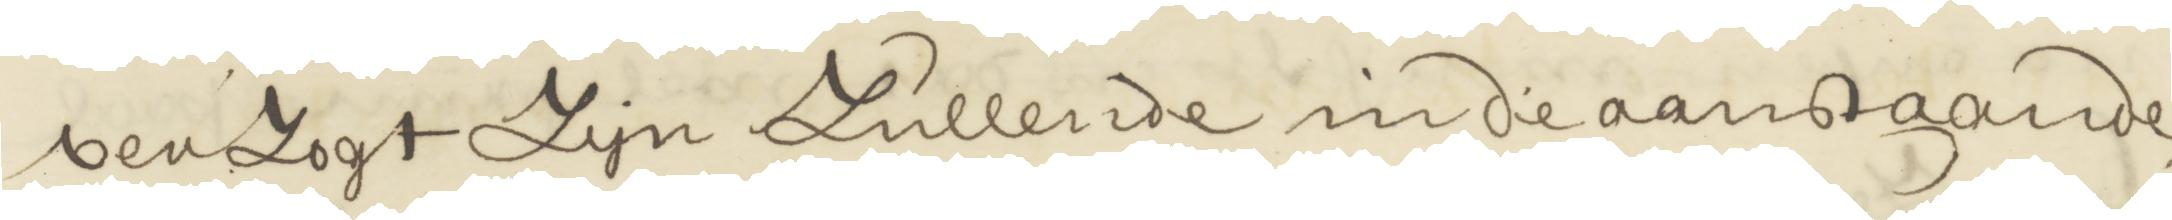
verzogt zijn zullende in de aanstaande
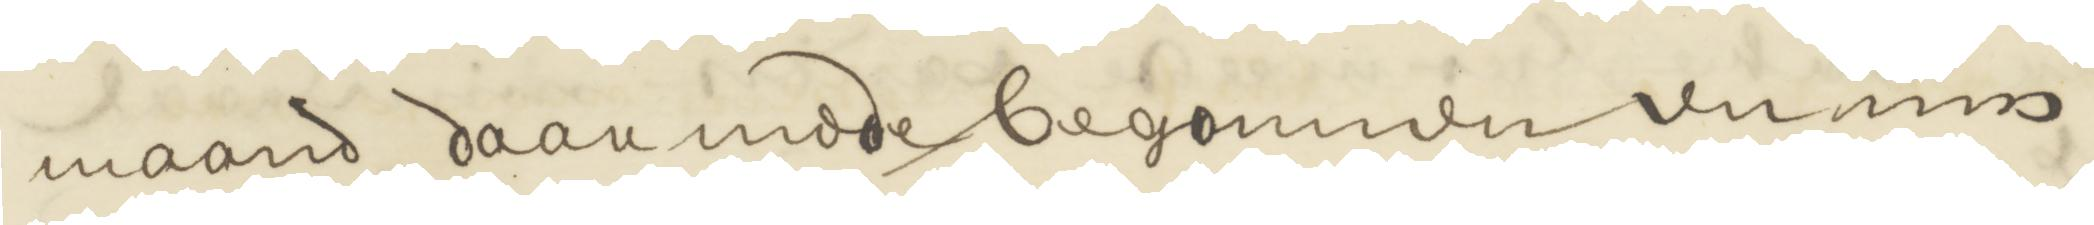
maand daar mede begonnen en uw
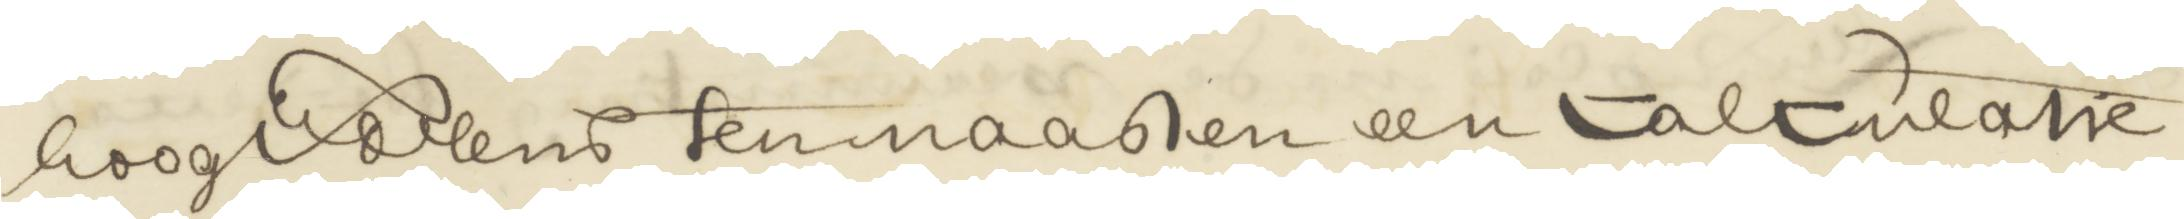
hoog Edelens ten naasten een calculatie
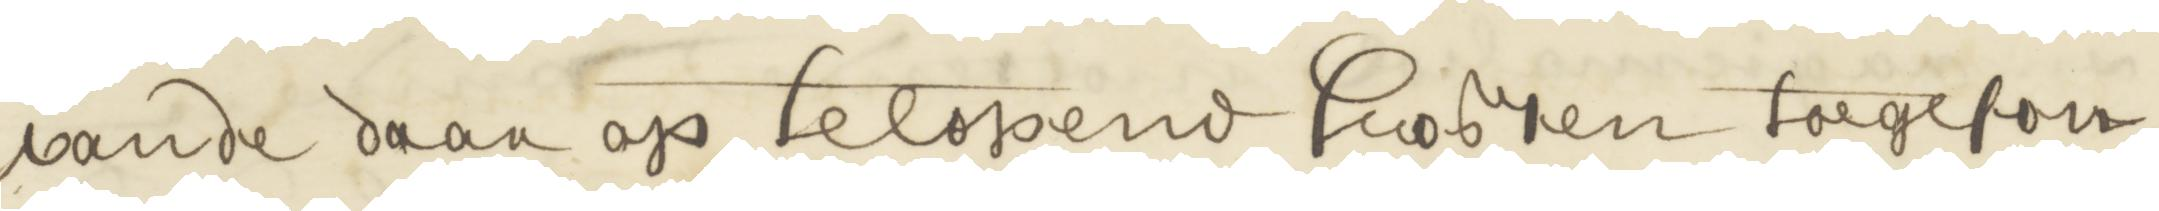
van de daar op telopene kosten toegeson
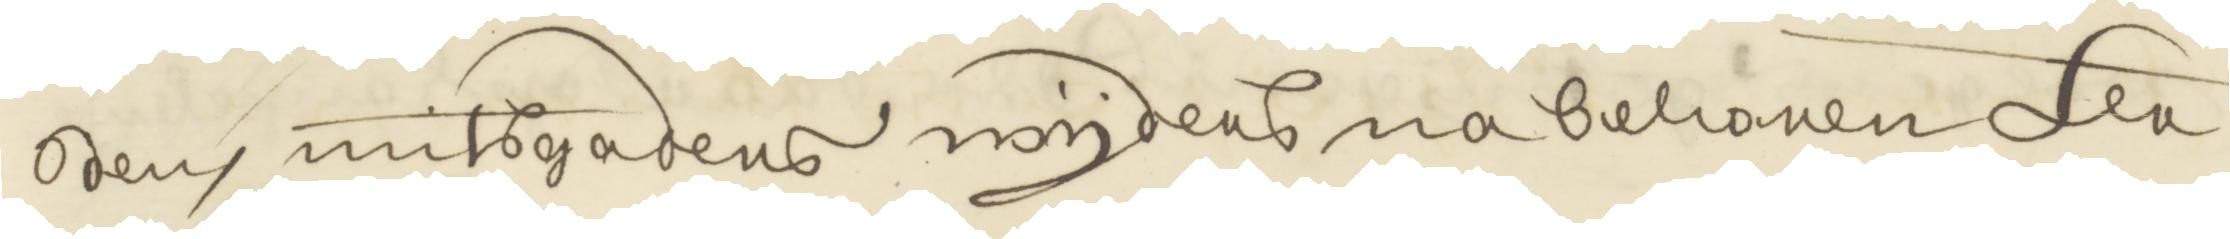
den, mitsgaders wijders na behoren ter
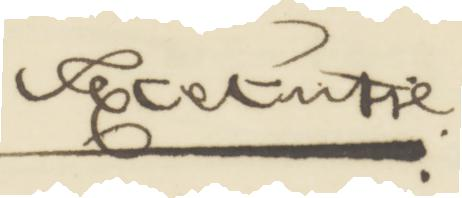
Excecutie
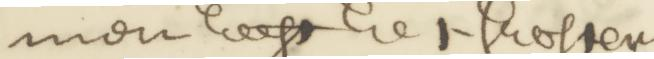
men heeft het kosten
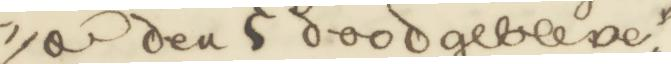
„ de der 5 dood gebleve„
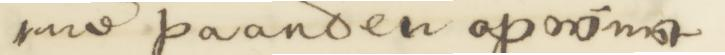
ne paarden op winst
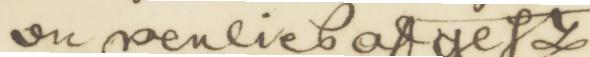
en verlies afgesz
